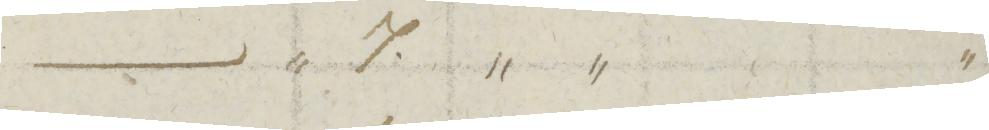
— „ 7. „ „ „
